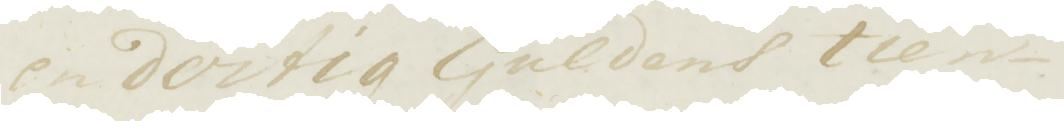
en dertig Guldens tien
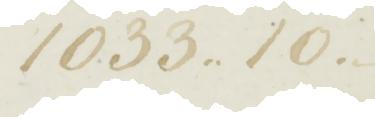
1033„ 10.
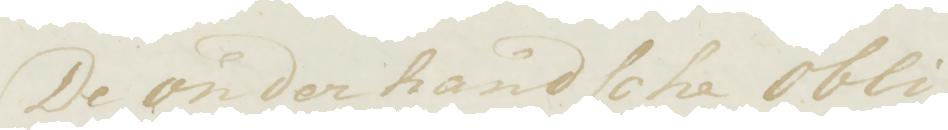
De onderhandsche obli
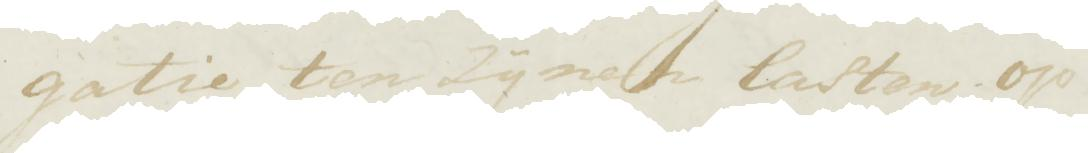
gatie ten zijnen lasten op
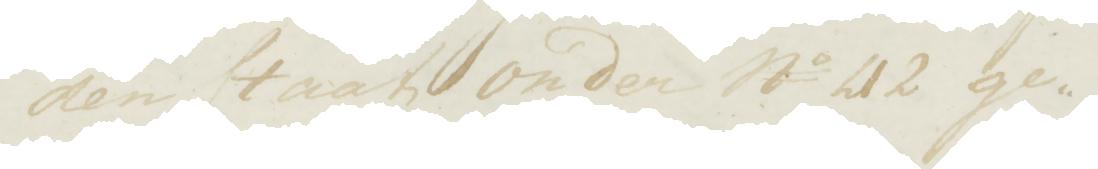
den staat onder N=o 42 ge„
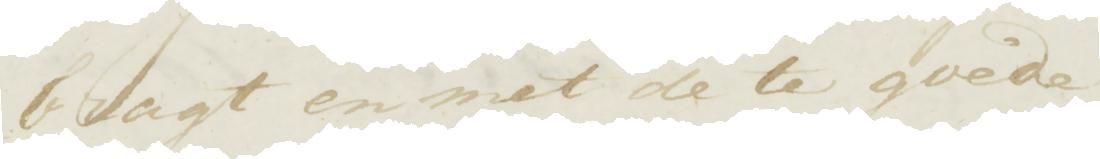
bragt en met de te goede
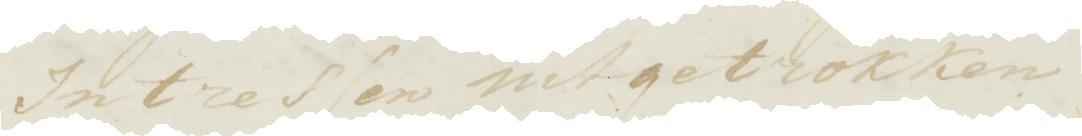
Intressen uitgetrokken
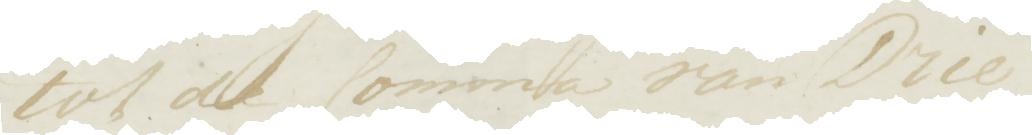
tot de somma van Drie
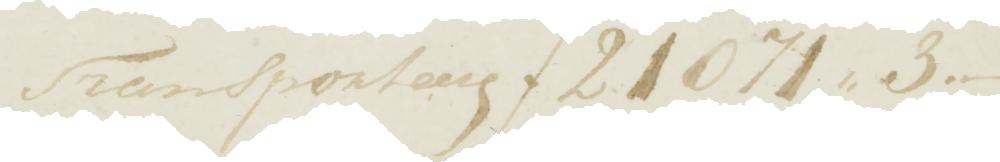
Transporteeren ƒ 21071 „ 3.-
